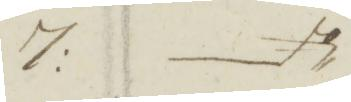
7: _„o
